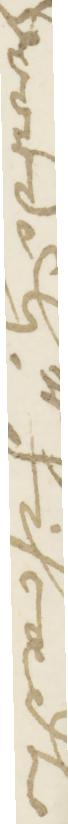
Voorde H.r fiscael
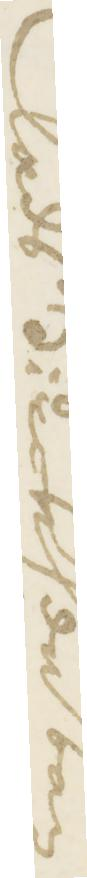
Claes dircksen van
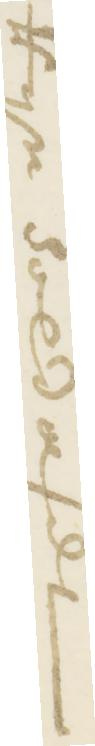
Ryn soldaet
